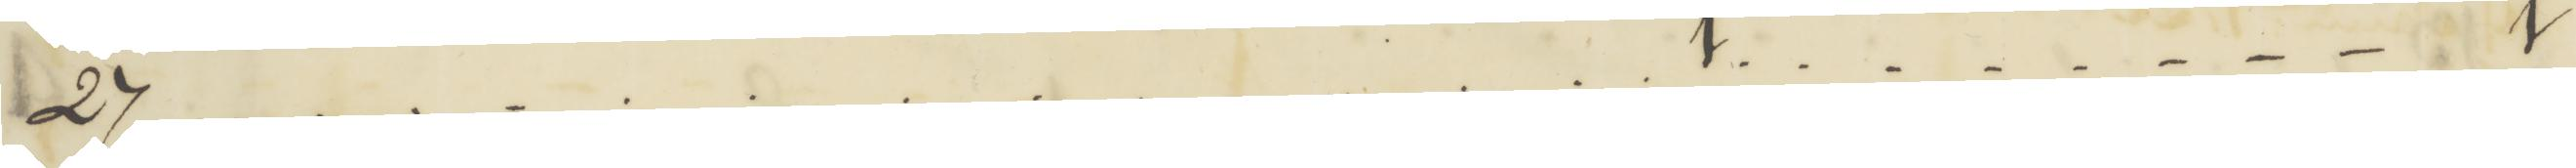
27. . . . . . . . . . . . . . . 1. . - - - - - - 1
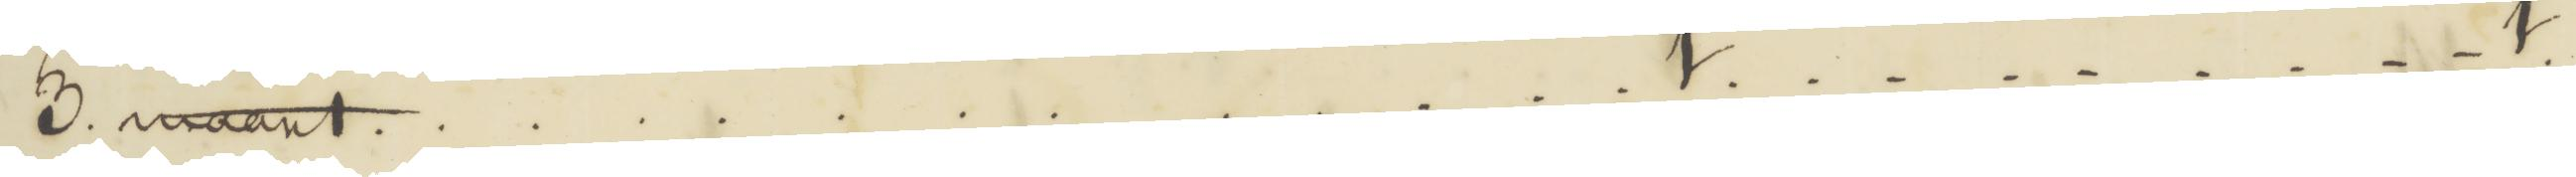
3. maart. . . . . . . . . . . . . 1. . - - - - - - 1
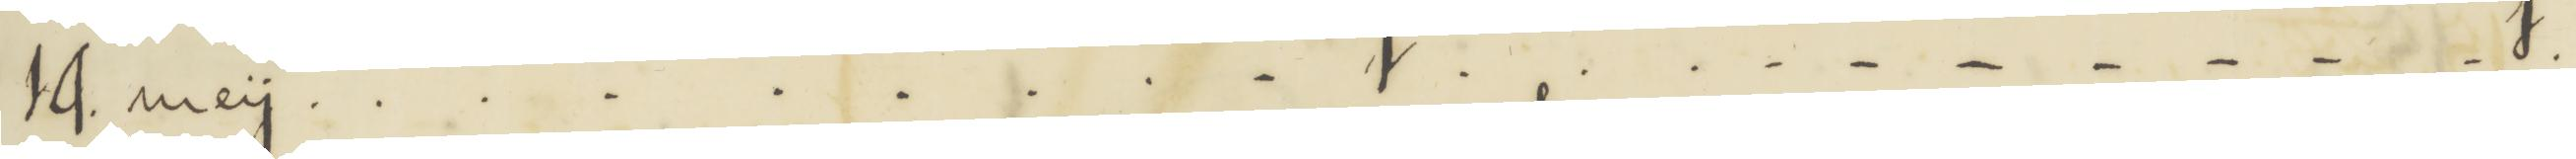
14. meij . . . . . . . . - 1 . . . - - – – – – - 1
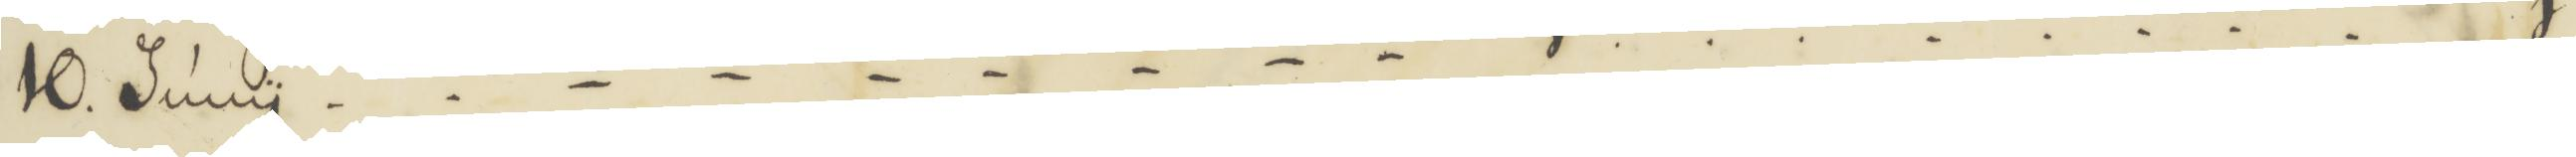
10. Iunij - - – – – – – – – 1 . . . . . . . . 1
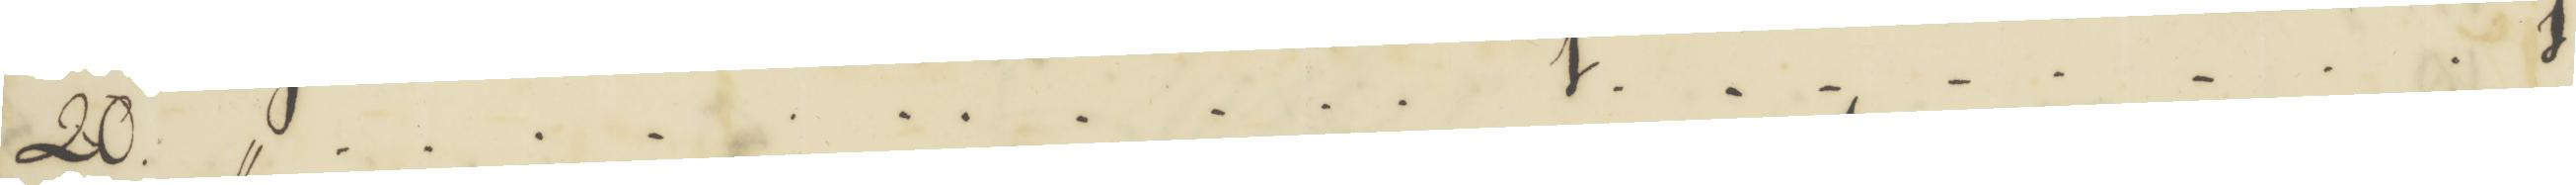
20. „ . . . . . . . . . . . 1 . - - - - - . . 1
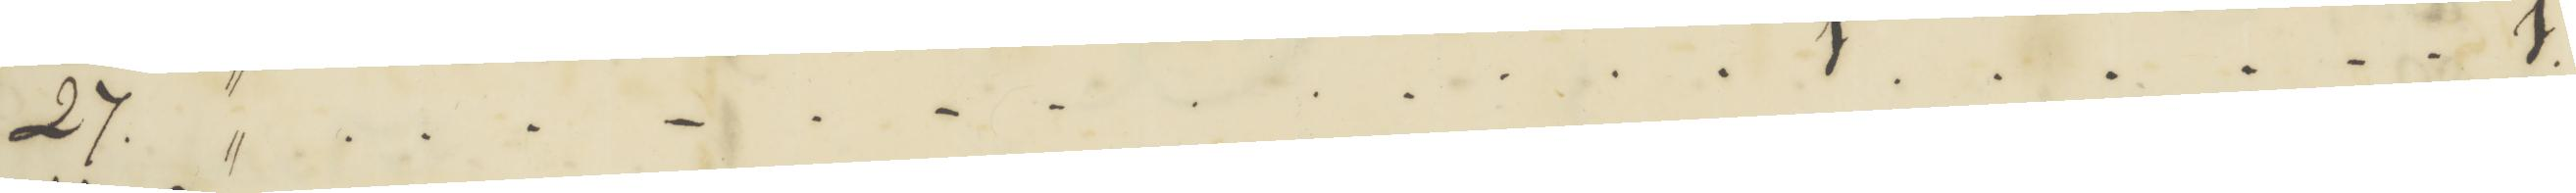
27. „ . . . – . - - . . . . . . 1 . . . . . . 1.
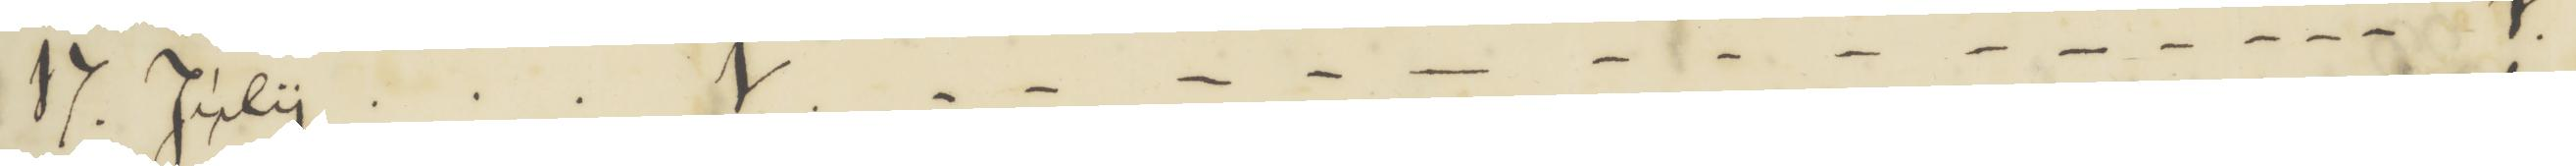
17. Julij . . . 1 . – – – – – – – – – – – – – – 1.
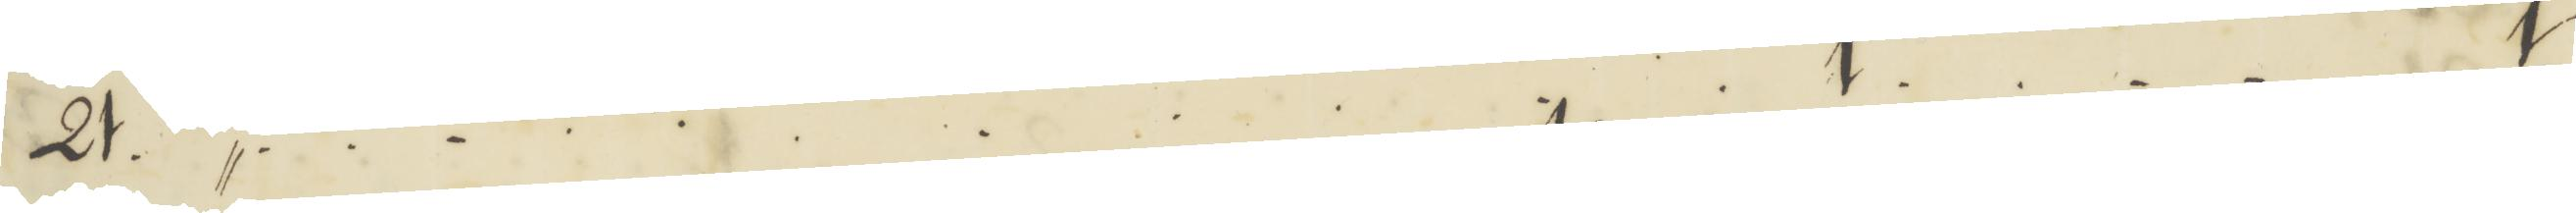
21. „ . . - . . . . . . . . 1 . . - - - 1
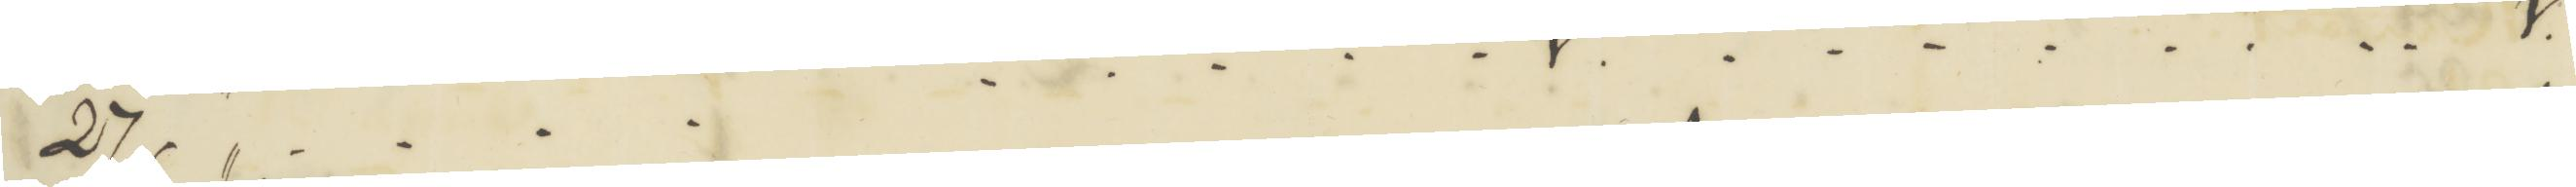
27 „ - - - - . . - . - 1. . - - - - . - - 1.
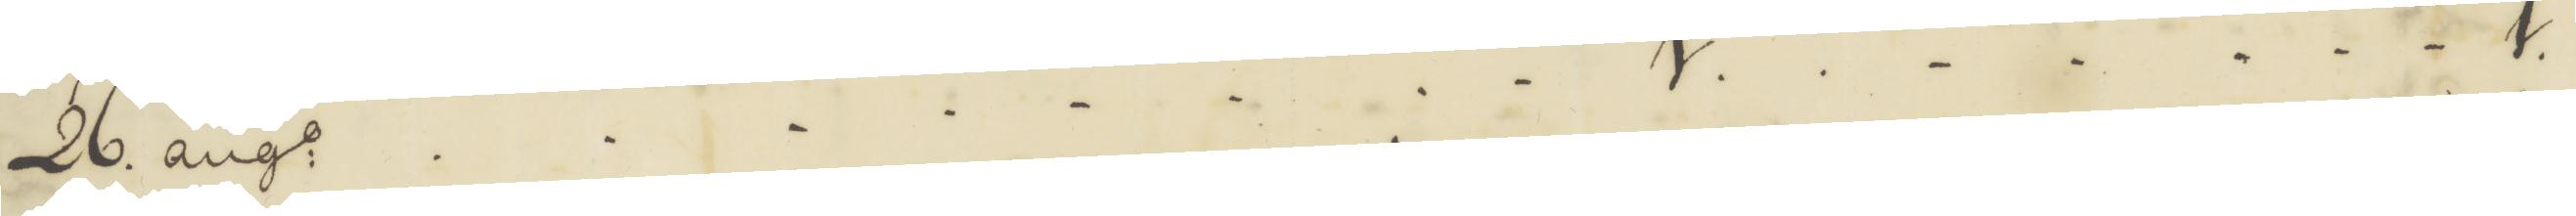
26. aug:o . . - . - - - - 1. . - - - - - 1.
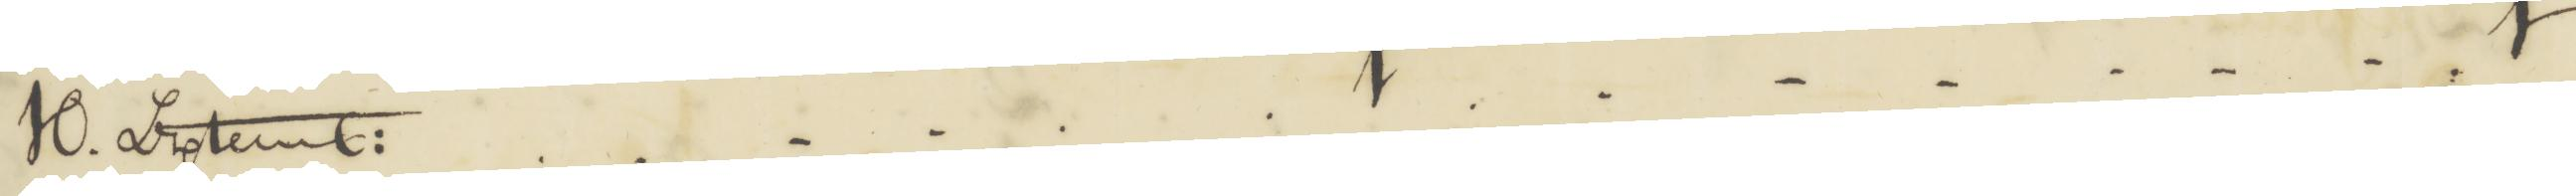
10. Septemb: . . - - . . 1 . . - - - - - . 1
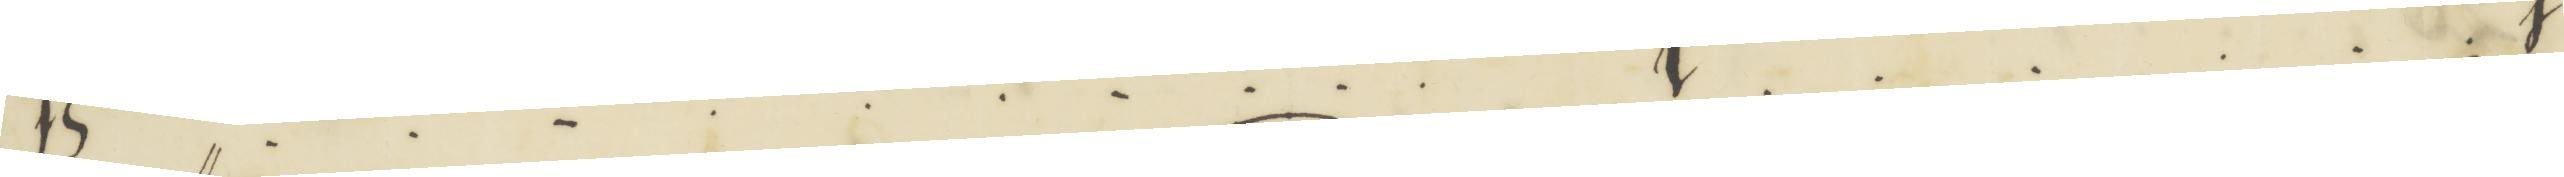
15 „ . . - . . . - . . . 1 . . . . . . 1
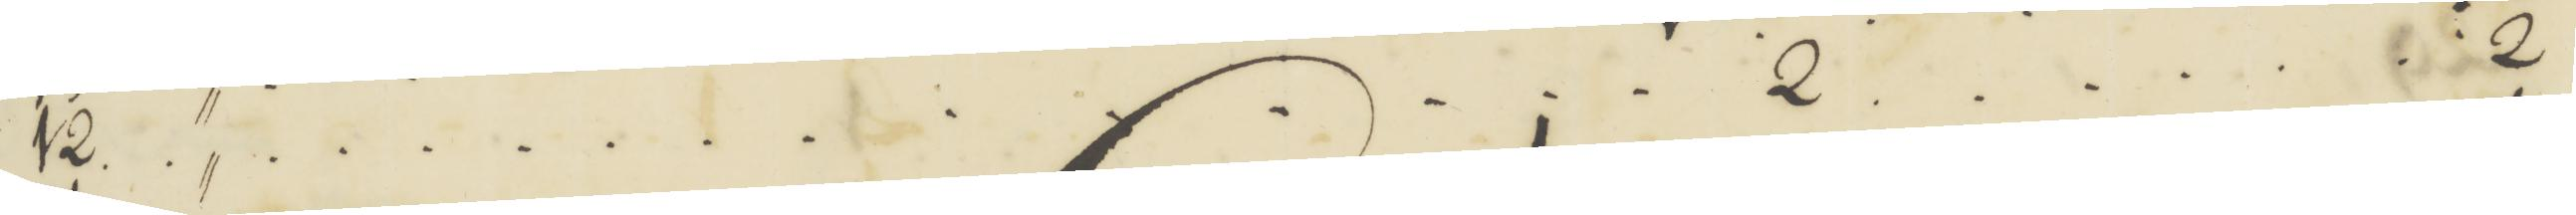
12. . „ . . . . . . . . . . . . . 2 . . . . . . . 2
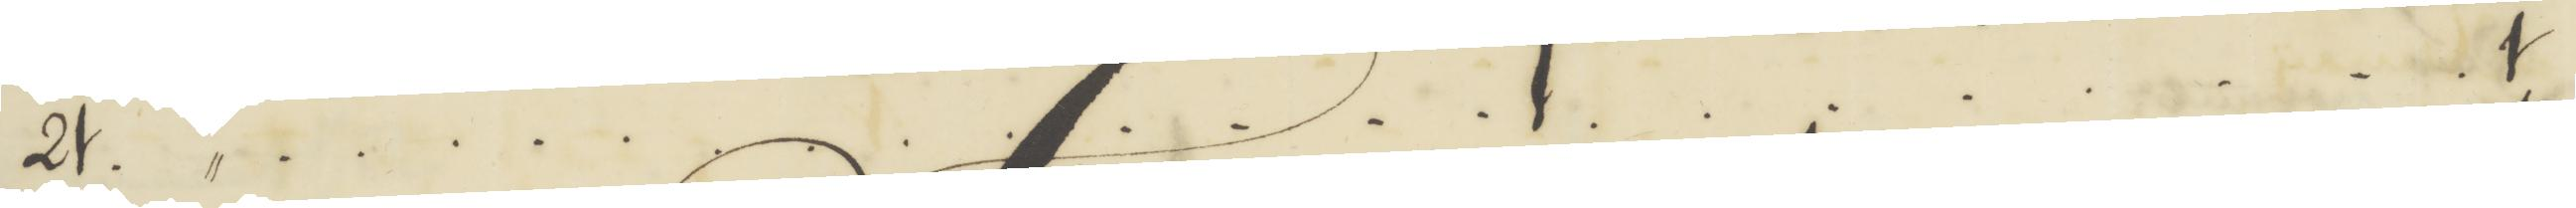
21. „ . . . . . . . . . . - - - 1 . . . . . . . . 1
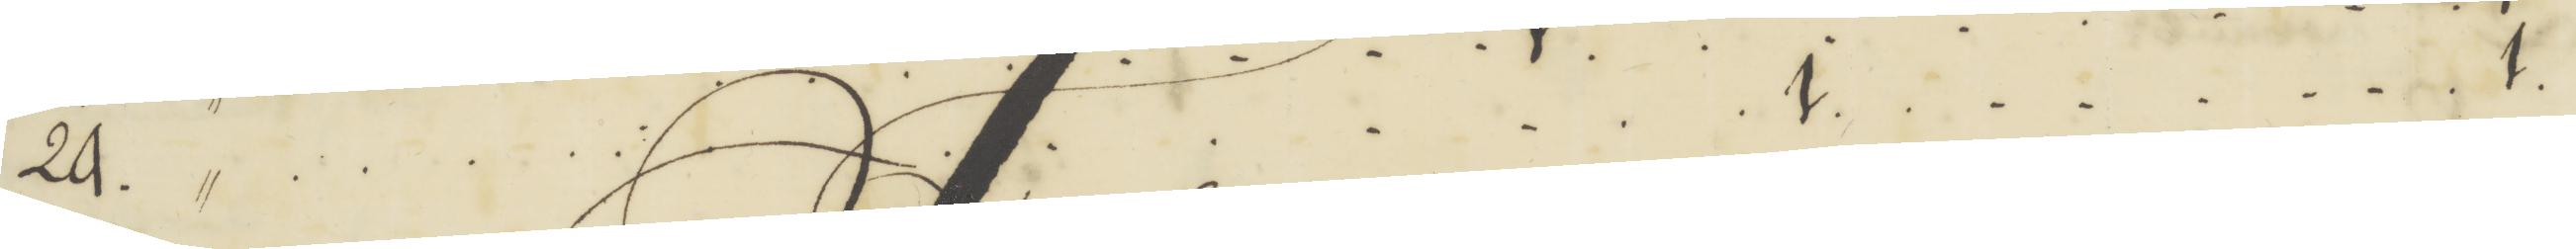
24. „ . . . . . . . . - - . . 1. . - - . - - . 1.
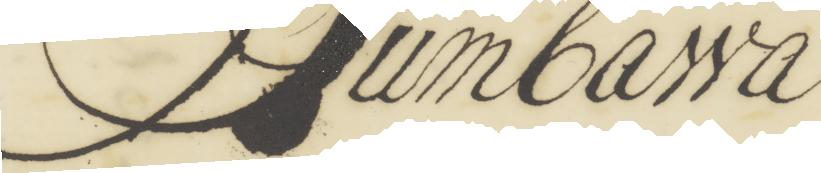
Sumbawa
